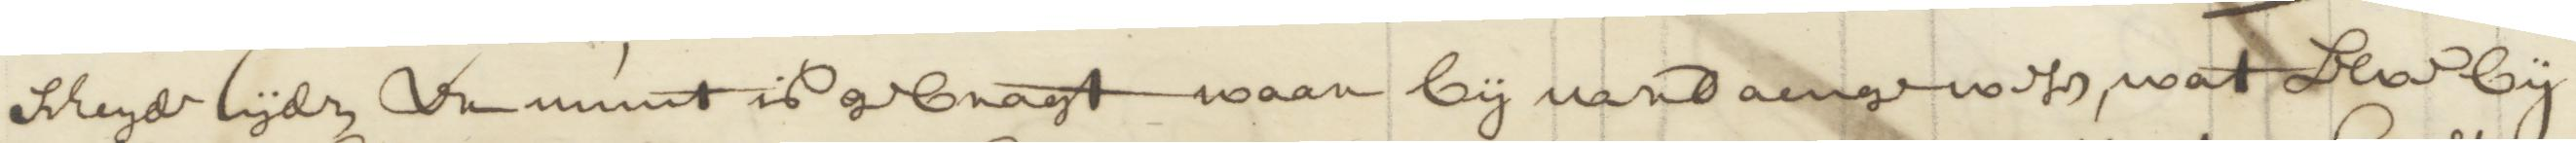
scheyde tijden ter munt is gebragt waar bij werd aengewesen, wat selve bij
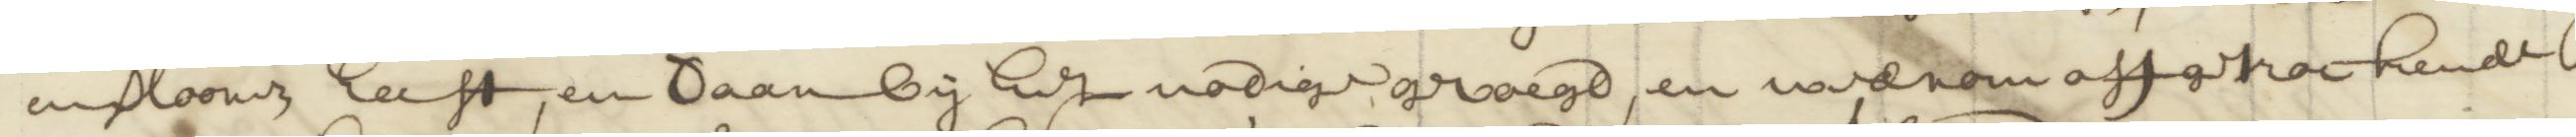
en verlooren heeft, en daarbij het nodige gevoegd, en wederom affgetrockende
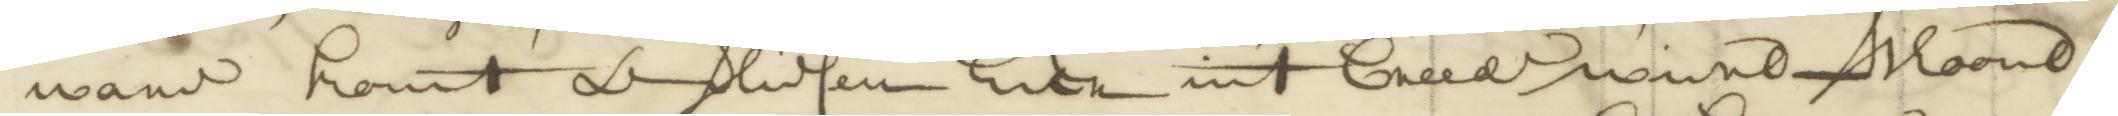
ware komt te verliesen hier in't breede wierd verthoond.
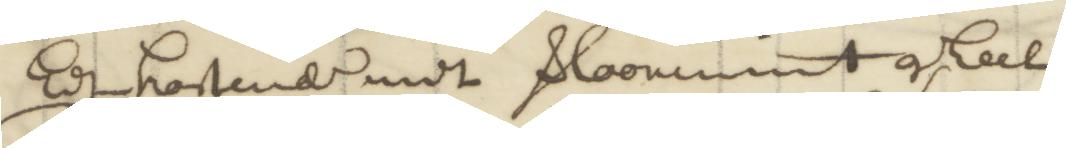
het kostende met verlooren int geheel
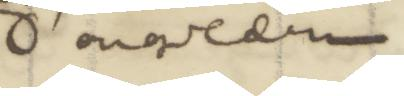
d’ongelden pr C=to
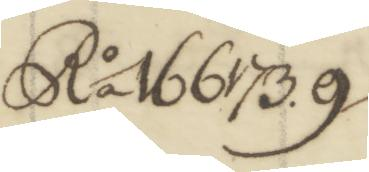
Ro/a 166173.9
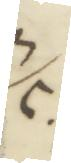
3/5
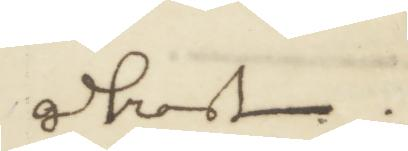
gekost . .
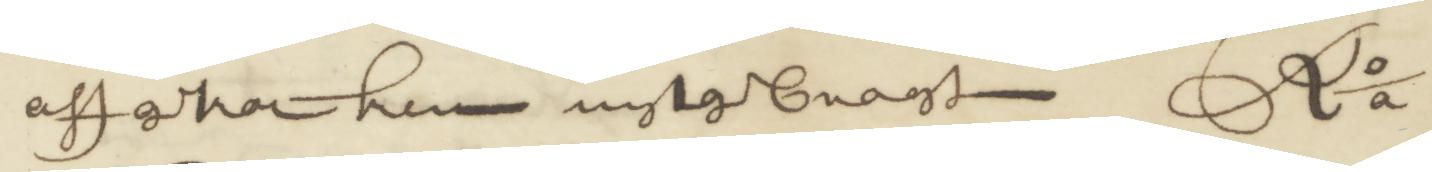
affgetrocken uytgebragt Ro/a
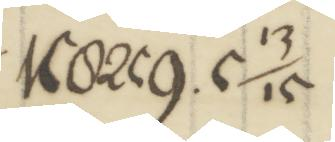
158259.5 13/15
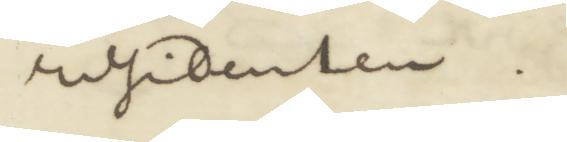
residenten .
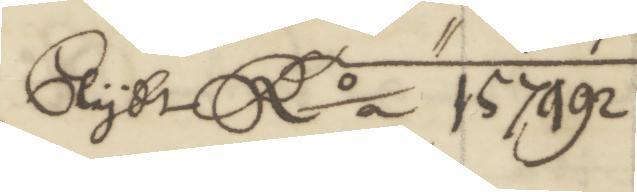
blijft Ro/a 157492
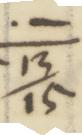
5 13/15
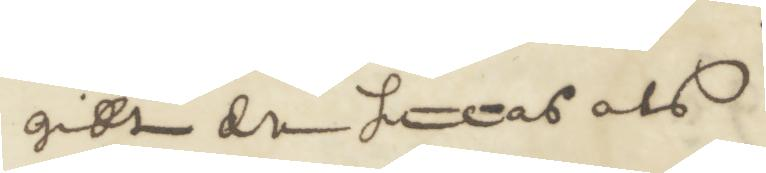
gift der siccas als
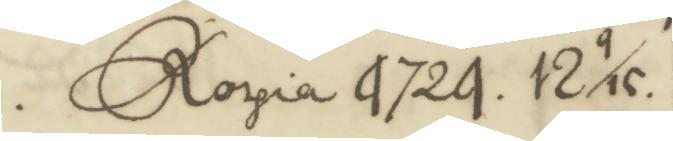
. Ropia 4724.12 9/15.
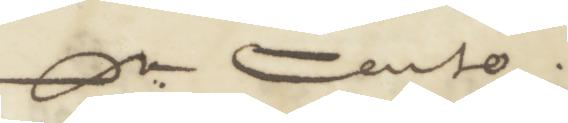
p:r Cento
